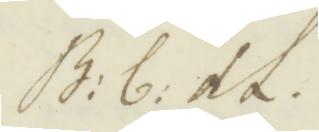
B: C: dL.
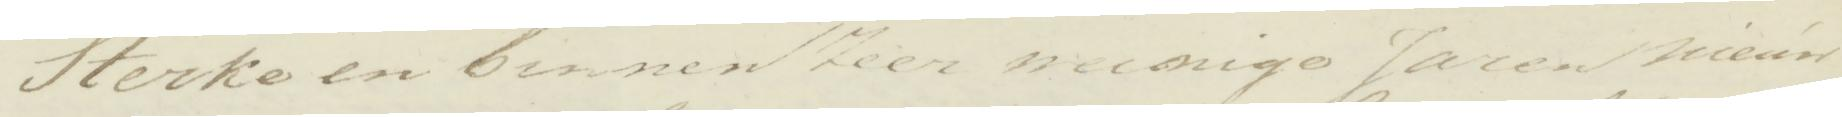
sterke en binnen zeer weinige Jaren nieuw
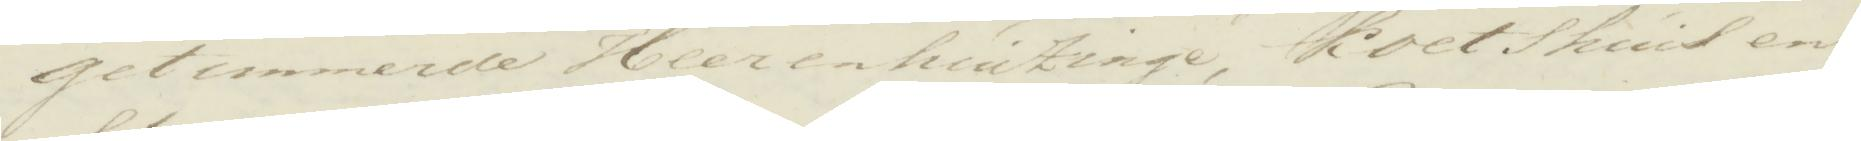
getimmerde Heeren huizinge, Koetshuis en
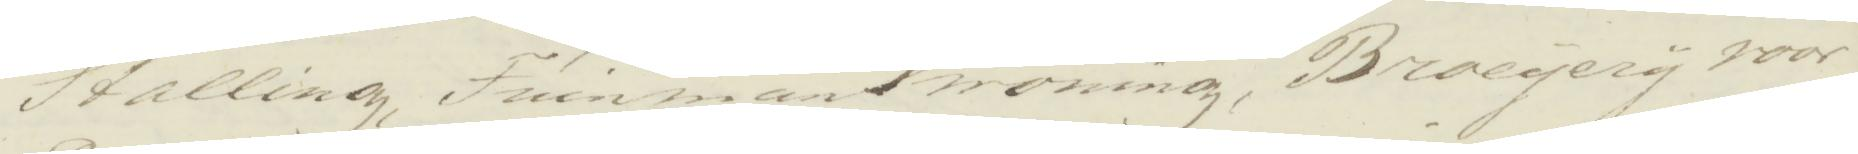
stalling, Tuinmanswoning, Broeijerij voor
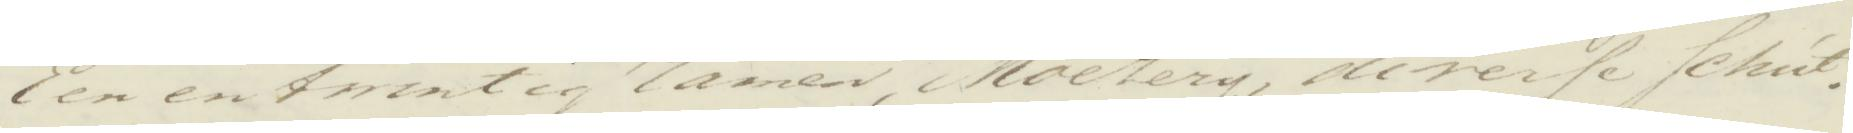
Een en twintig ramen, Moezery, diverse schut„
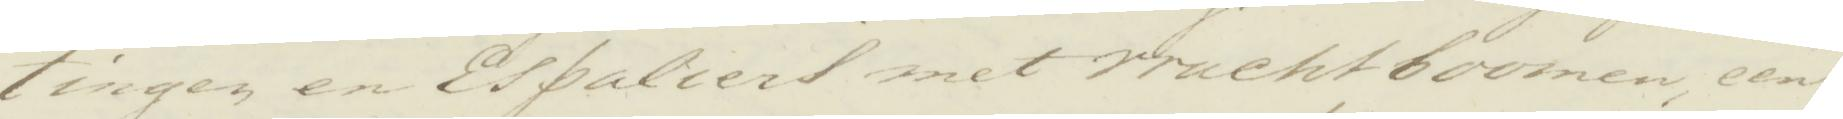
tingen en Espaliers met vrachtboomen, een
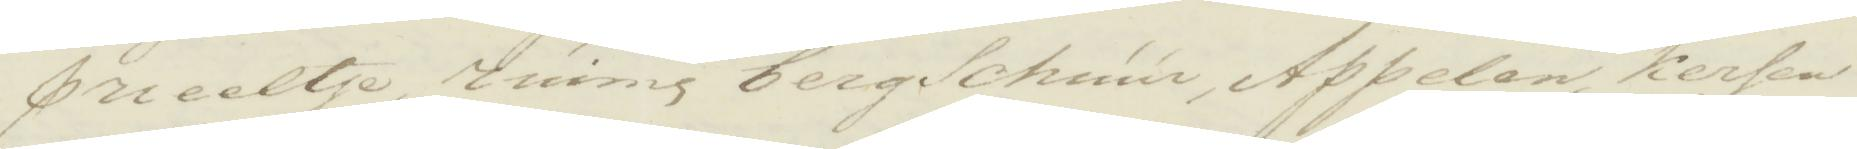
prieeltje, ruime bergschuur, Appelen, kersen
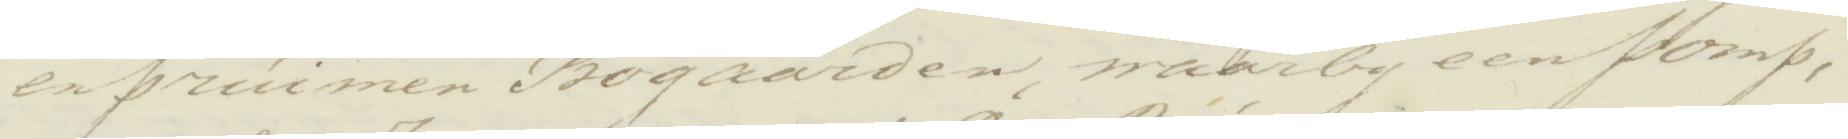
en pruimen Bogaarden, waarby een pomp,
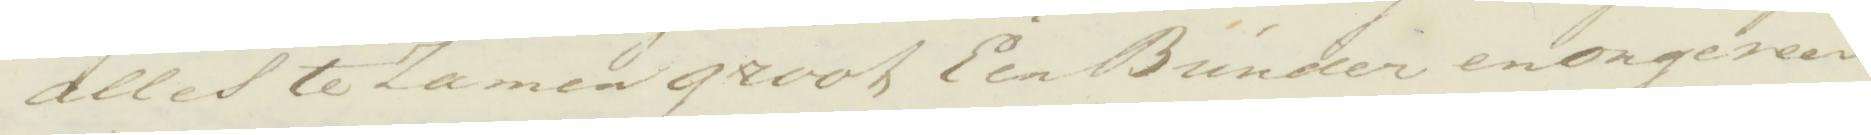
alles te zamen groot Een Bunder en ongeveer
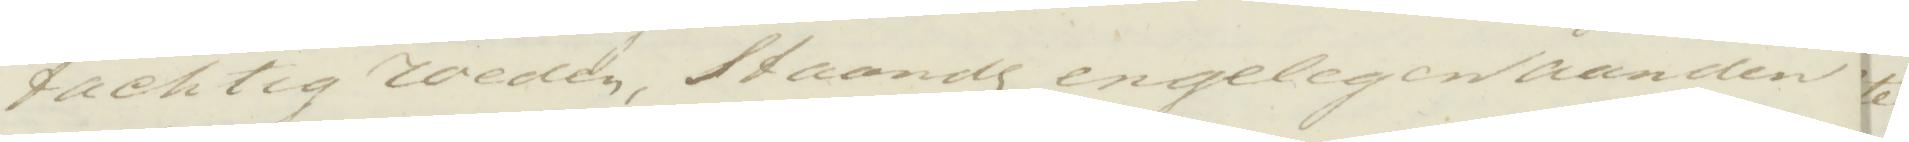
tachtig roeden, staande en gelegen aan den
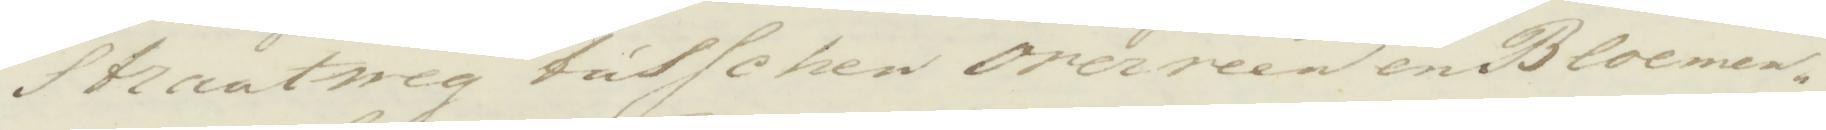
straatweg tusschen Overreen en Bloemen„
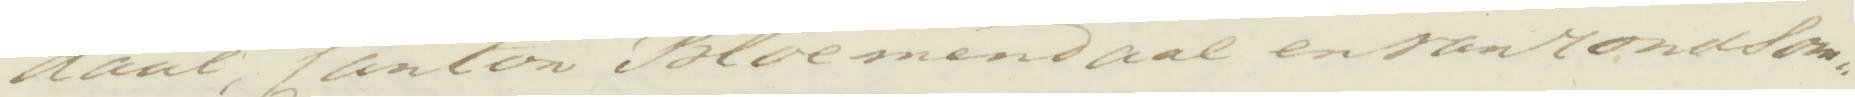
daal, Canton Bloemendaal en van rondsom„
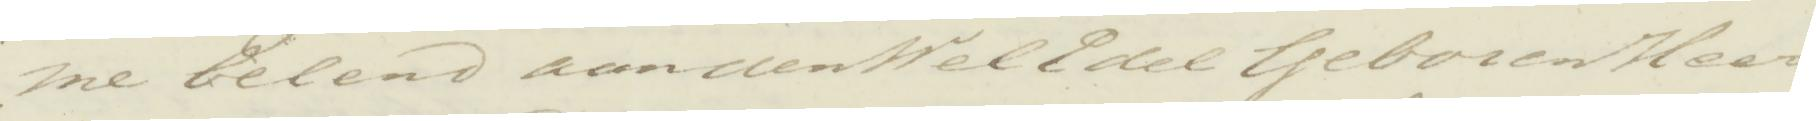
me belend aan den Wel Edel Geboren Heer
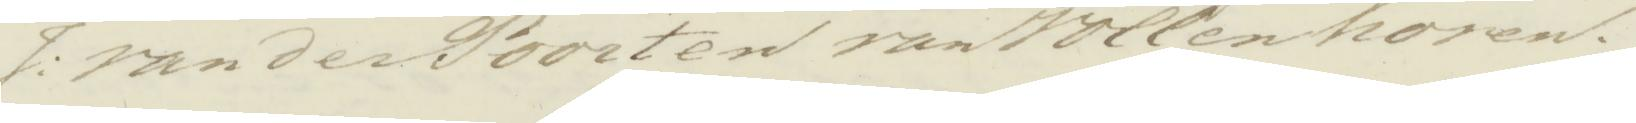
J: van der Poorten van Vollen hoven.
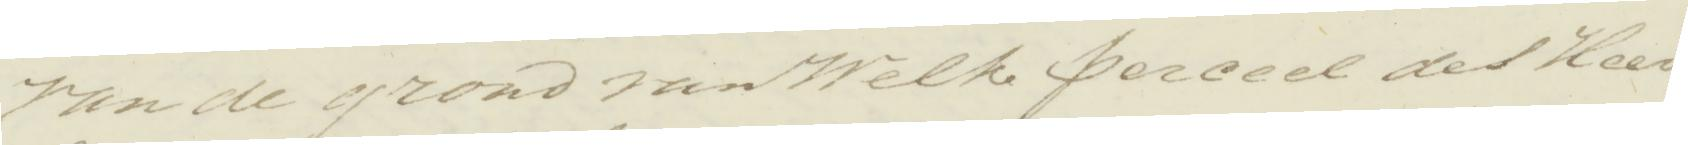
Van de grond van Welk perceel des Heer
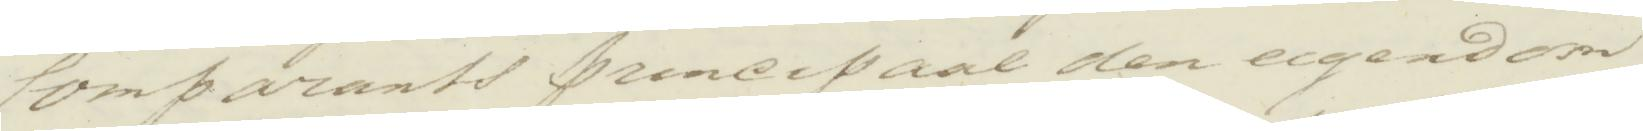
Comparants principaal den eigendom
